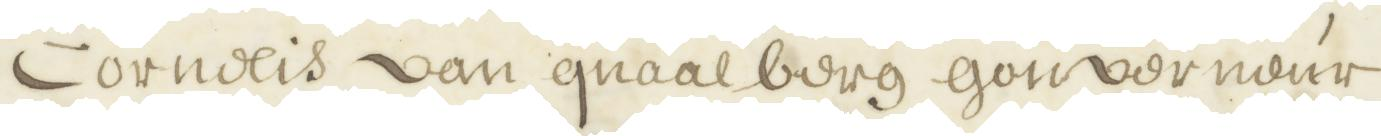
Cornelis van quaalberg gouverneur
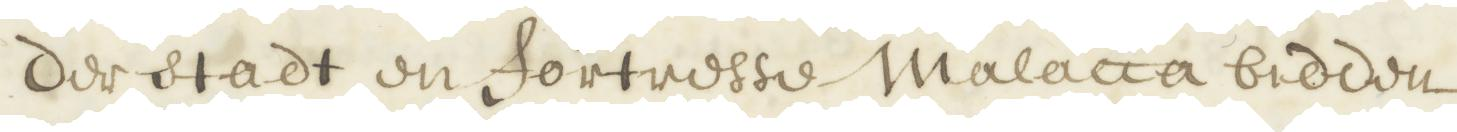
der stadt en fortresse Malacca bidden
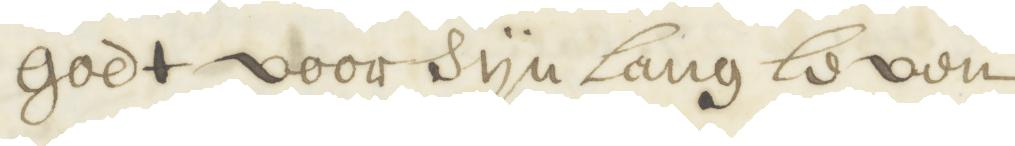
godt voor sijn lang leven
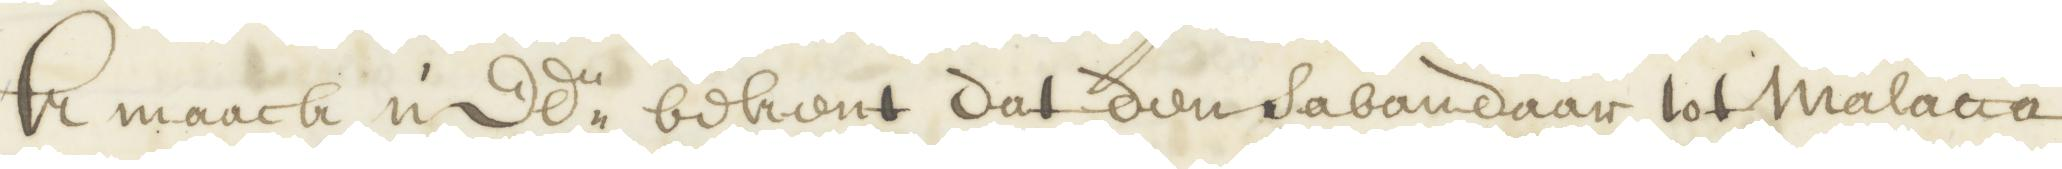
k maack u Ed„n bekent dat den sabandaar tot Malacca
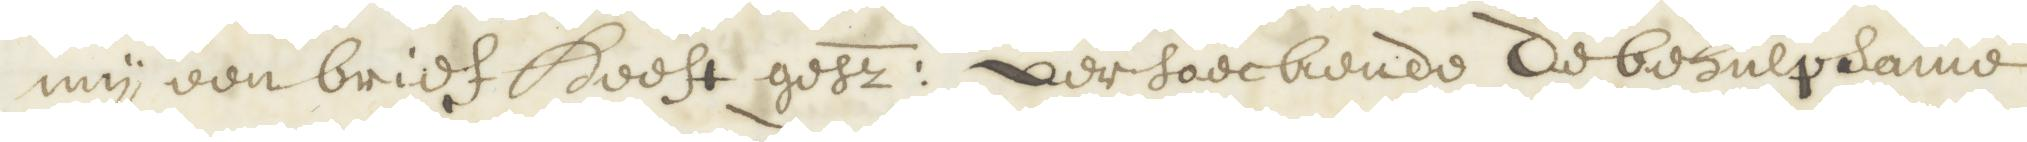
mij een brief heeft gesz: versoeckende de behulpsame
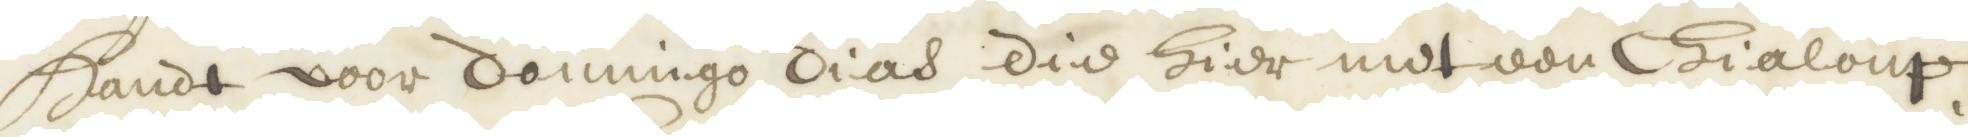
handt voor domingo dias die hier met een Chialoup
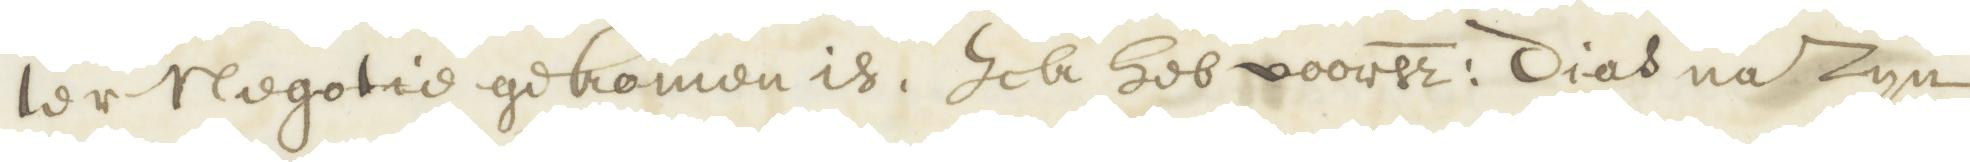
ter Negotie gekomen is. Jck heb voorsz: dias na zijn
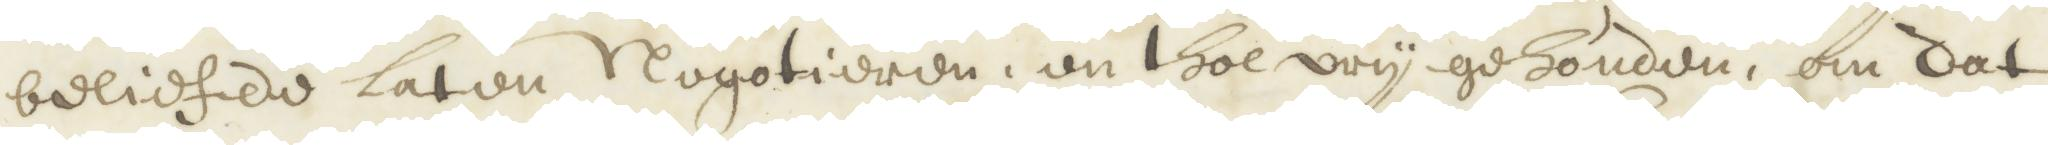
beliefde laten Negotieren, en thol vrij gehouden, om dat
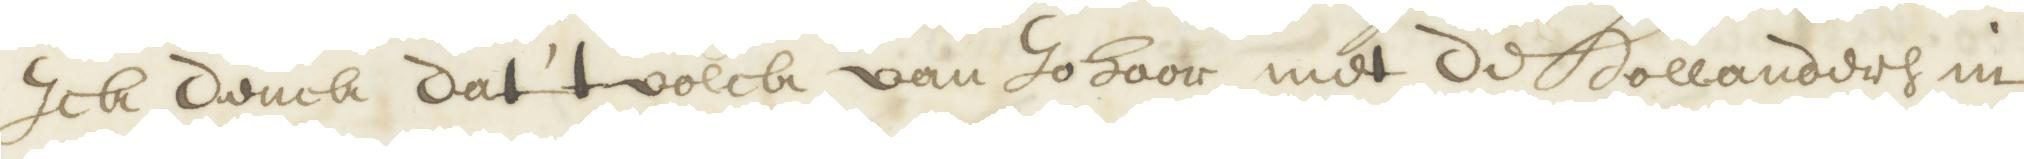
Jck denck dat ’t volck van Johoor met de Hollanders in
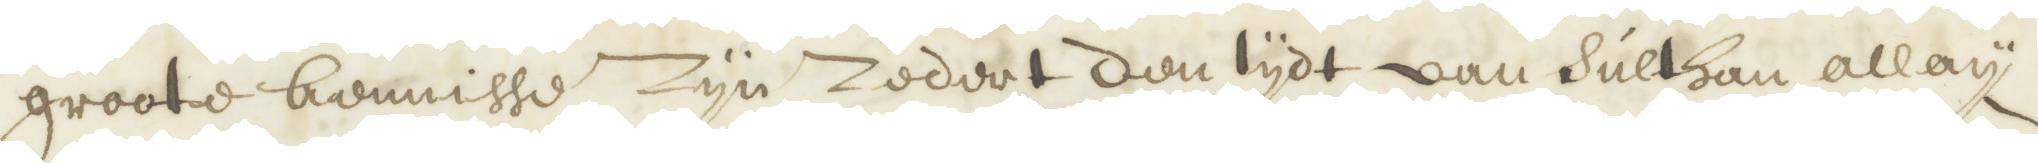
groote kennisse zijn zedert den tijdt van sulthan allaij
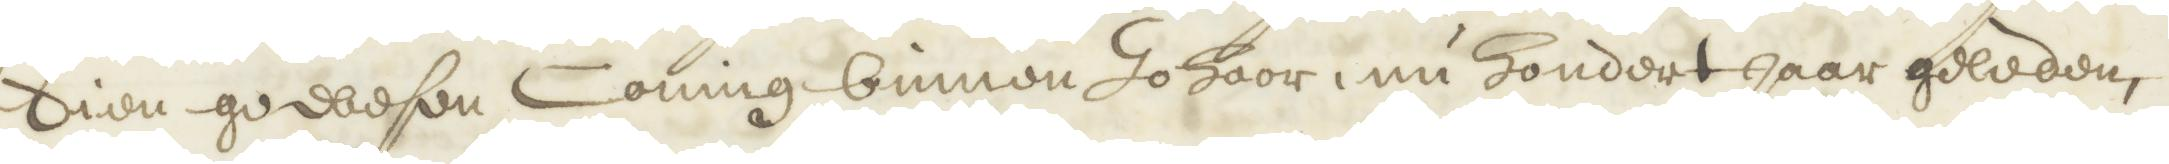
dien gewesen Coning binnen Johoor, nu hondert jaar geleden,
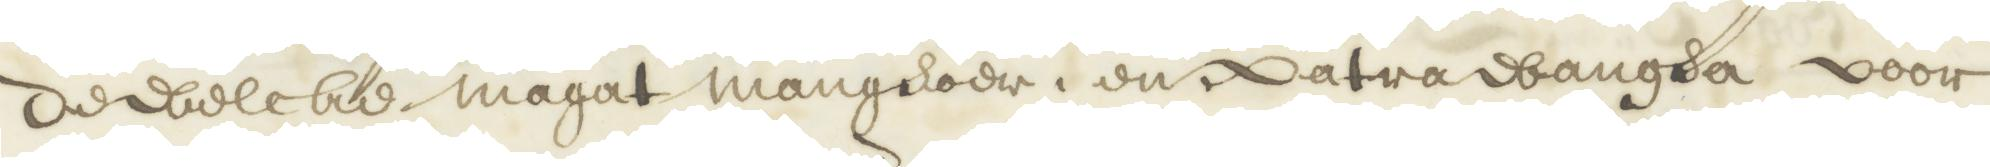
dewelcke magat mangsoer, en patrawangsa voor
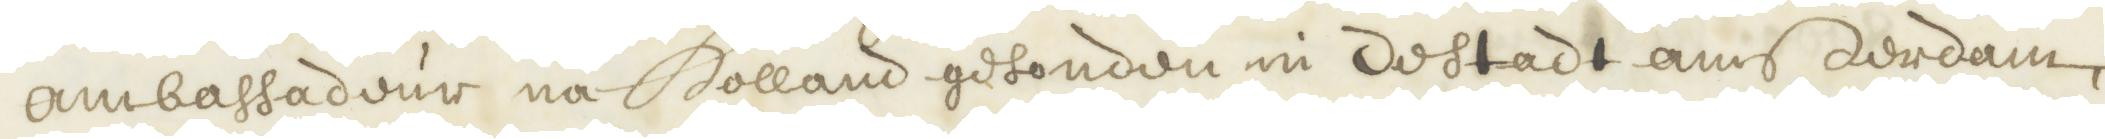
ambassadeur na Holland gesonden in de stadt amsterdam,
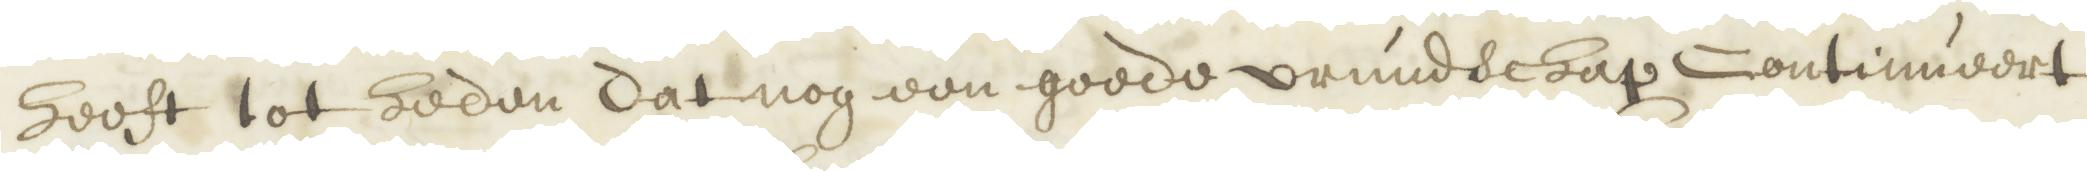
heeft tot heden dat nog een goede vrundschap continueert
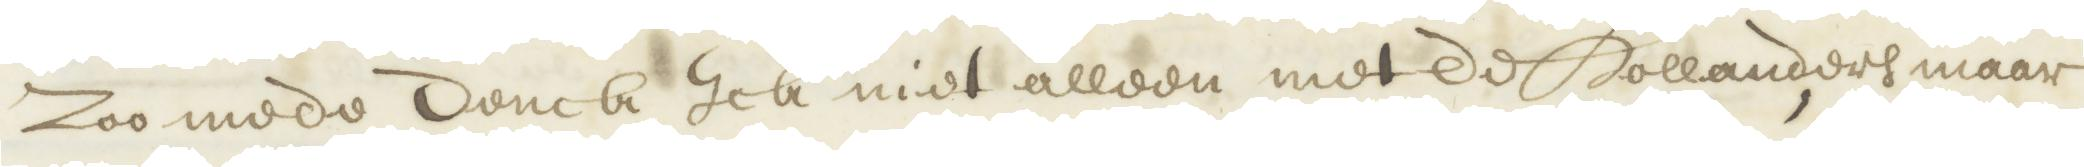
zoo mede denck Jck niet alleen met de Hollanders maar
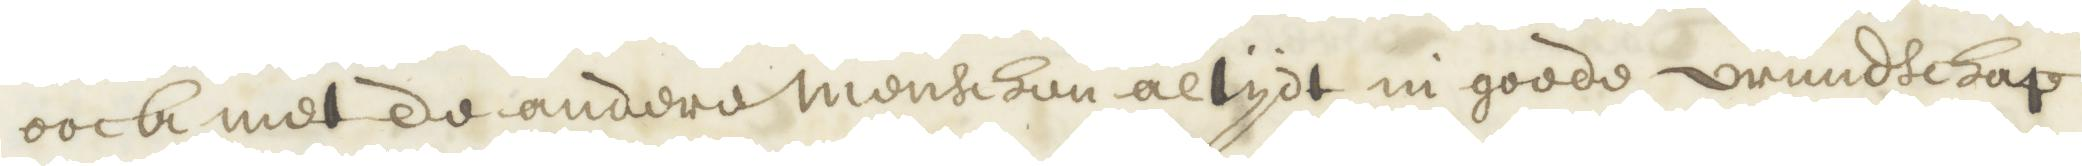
oock met de andere menschen altijdt in goede vrundschap
